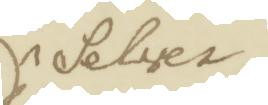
„ selver
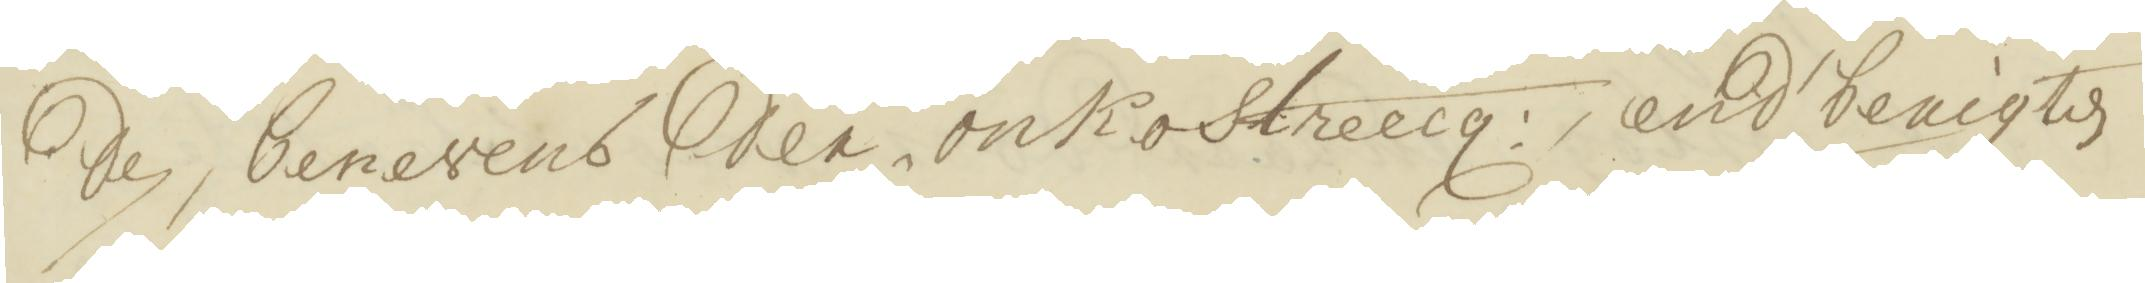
de, benevens der „ onkostreecq:, end' berigten
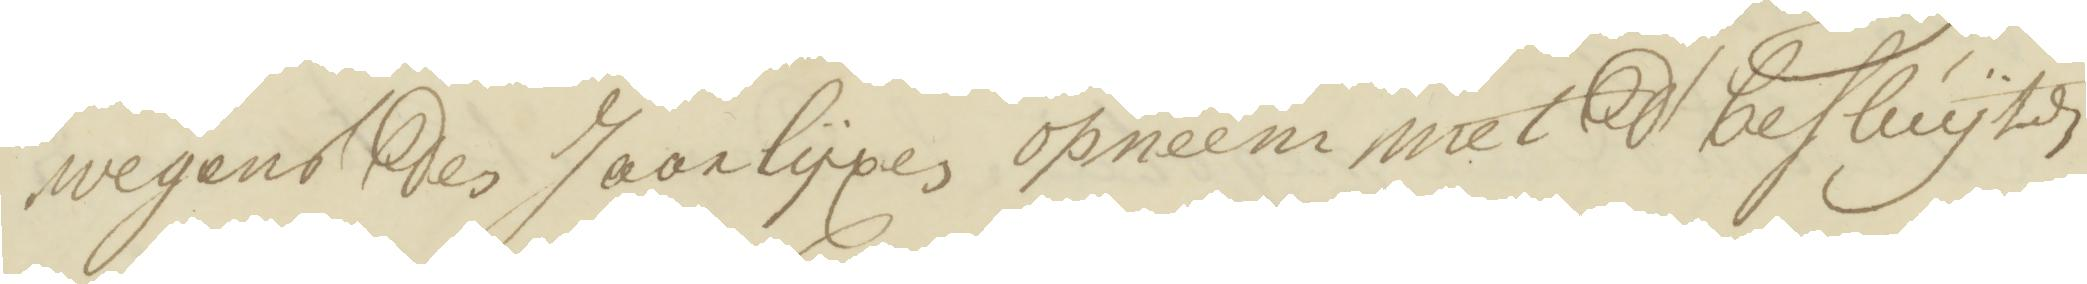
wegens den Jaarlijxen opneem met d' besluijten
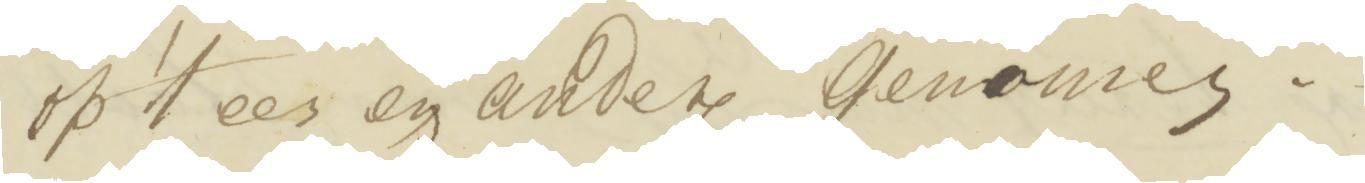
op ’t een en ander genomen.
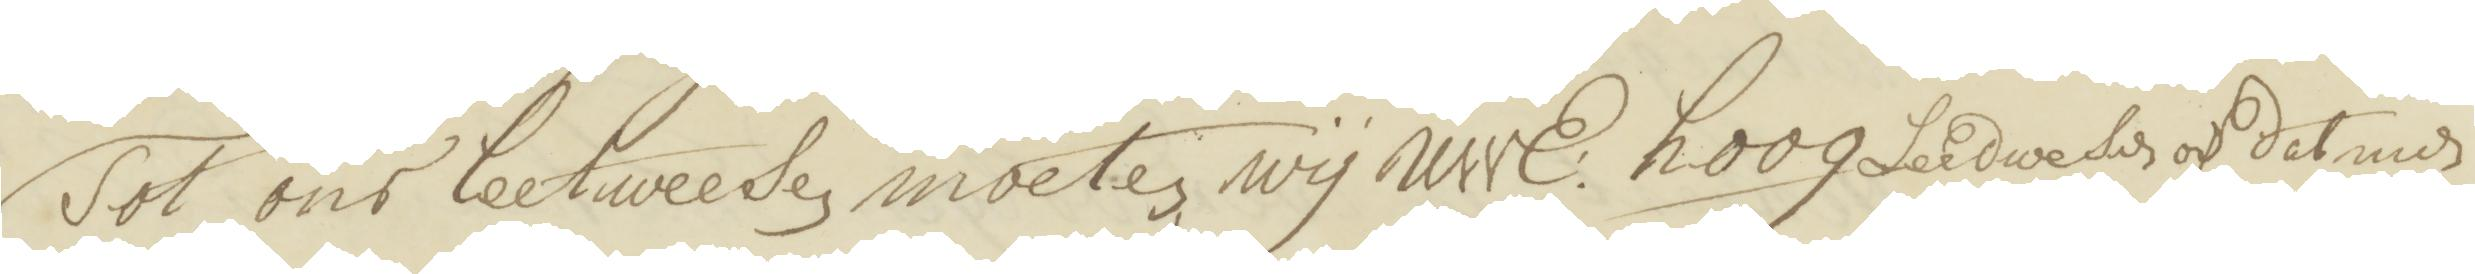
Tot ons leetweesen moeten wij uwE: hoog leedwesen over dat men
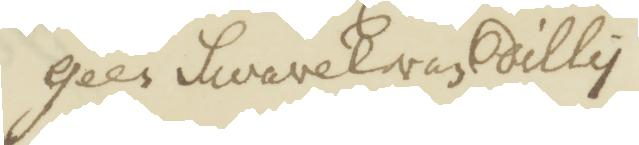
geen Swavel van dillij
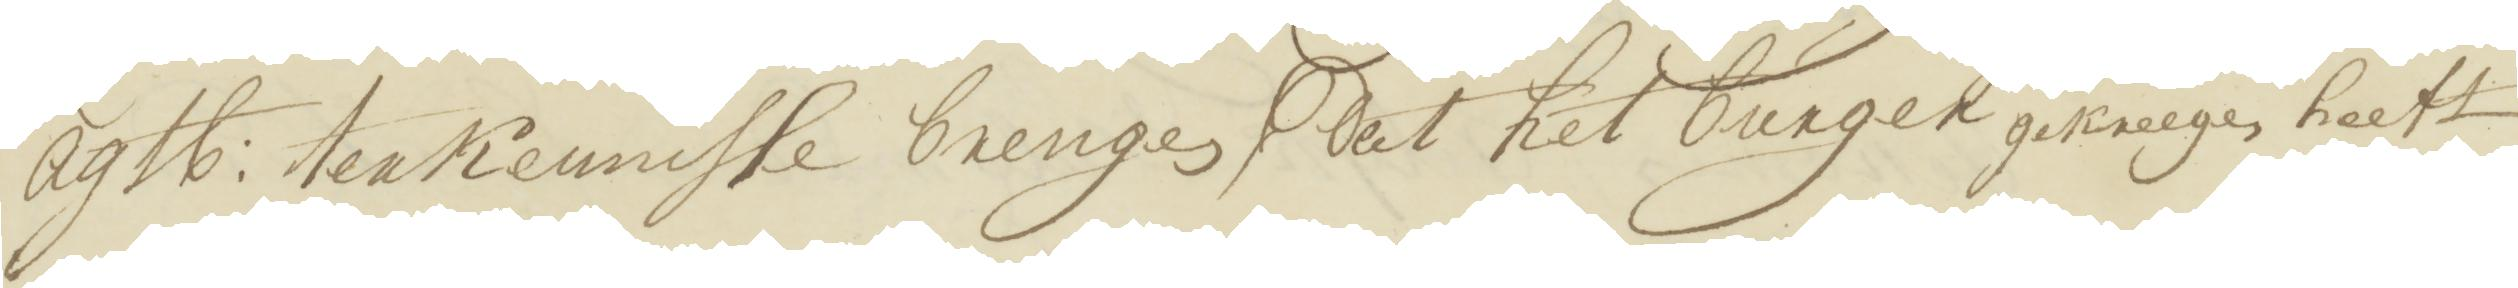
agtb: ter kennisse brenge, dat het burger gekreegen heeft
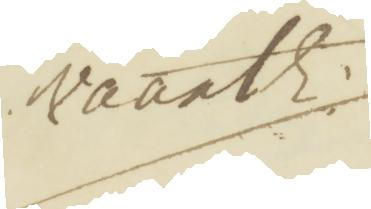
„vaarth:
